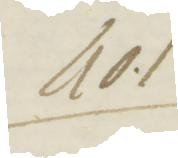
40.1
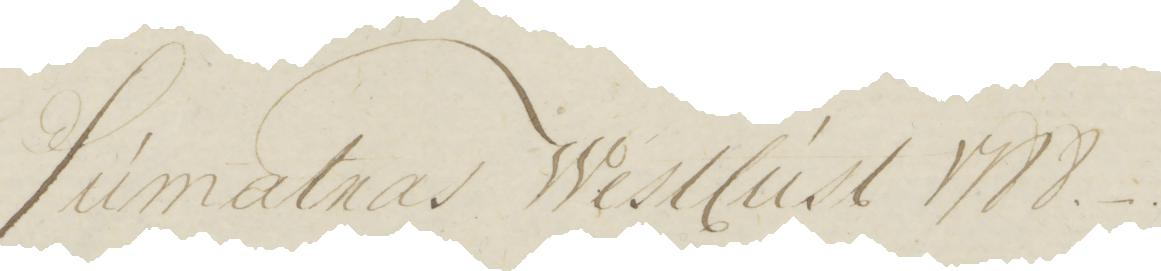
Sumatras Westcust 1788.-.
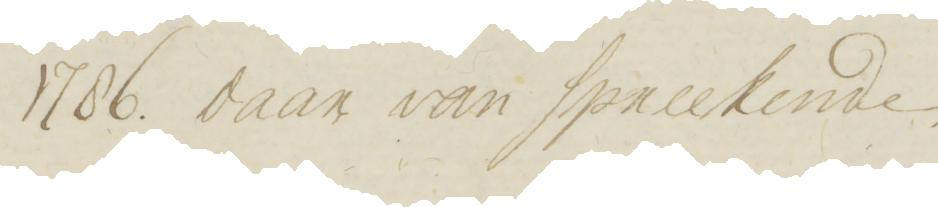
1786. daar van spreekende
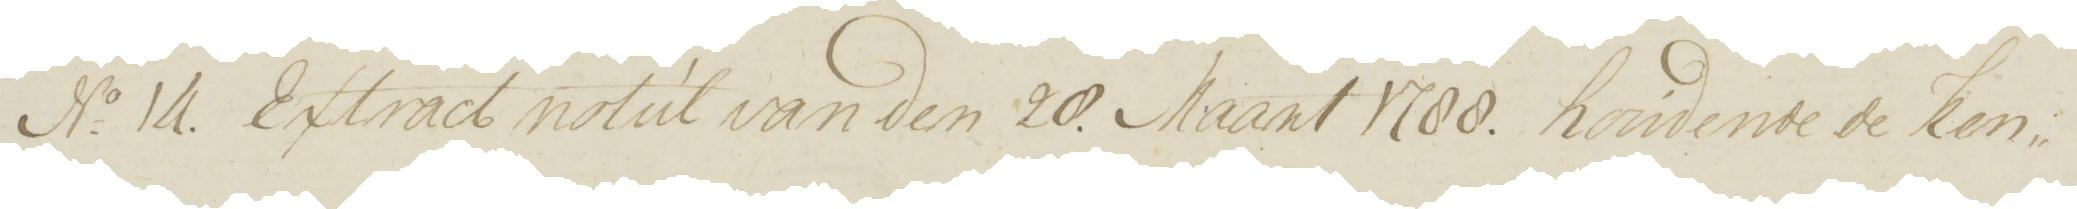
N=o 14. Extract notul van den 28. Maart 1788. houdende de ken„
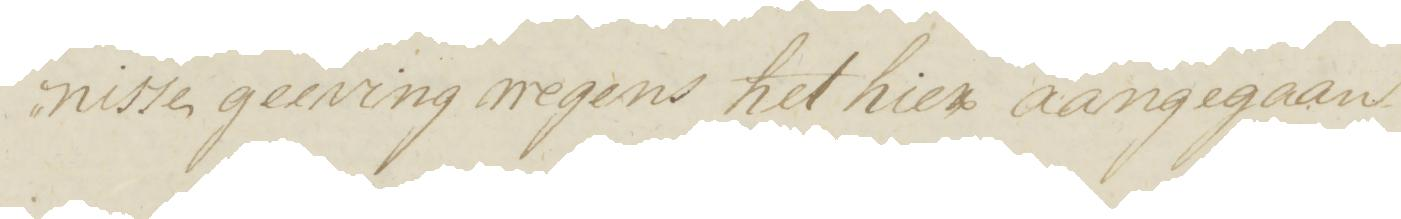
„nisse geeving wegens het hier aangegaan
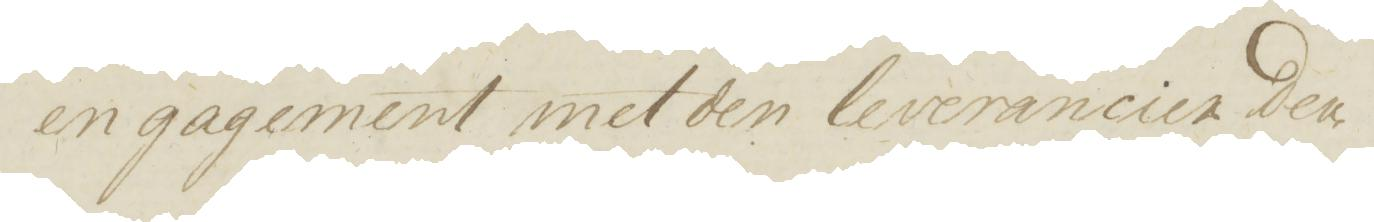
engagement met den leverancier der
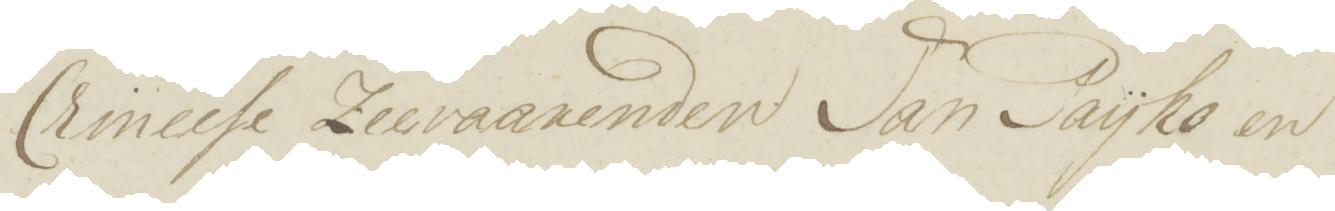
Chineese Zeevaarenden Jan Paijko en
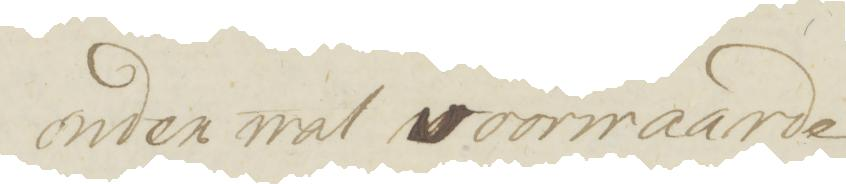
onder wat voorwaarde
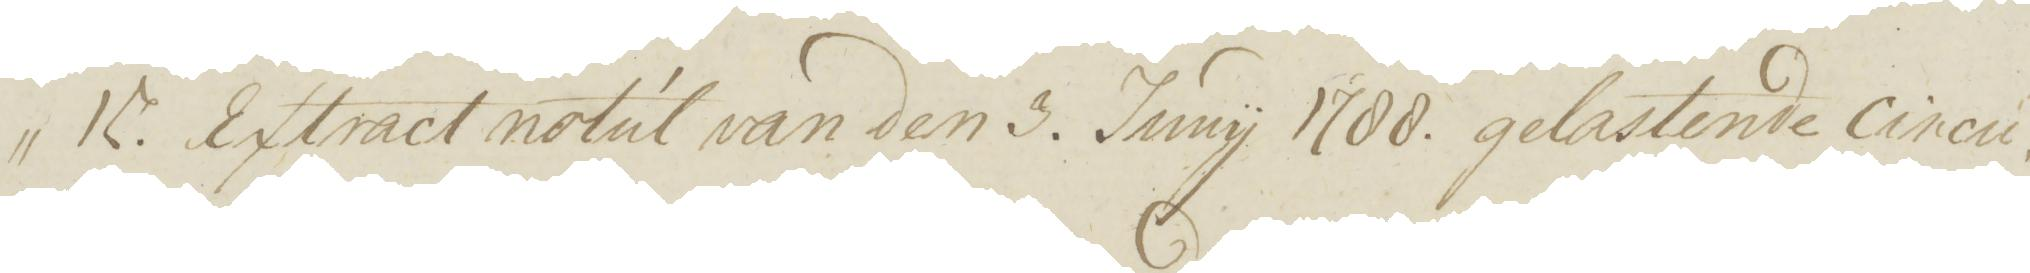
„ 15. Extract notul van den 3. Junij 1788. gelastende circu„
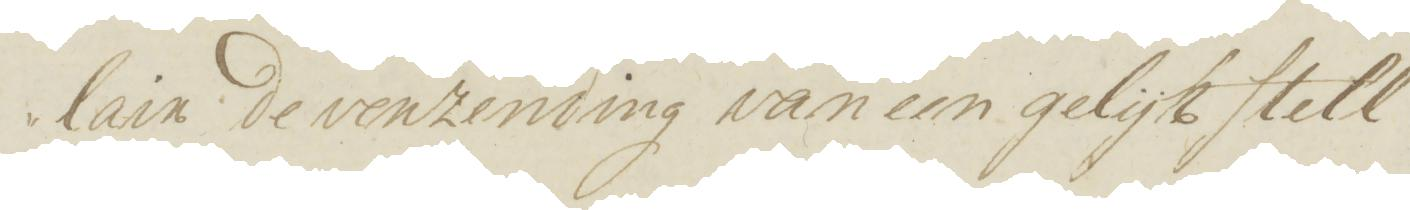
„lair de verzending van een gelijk stell
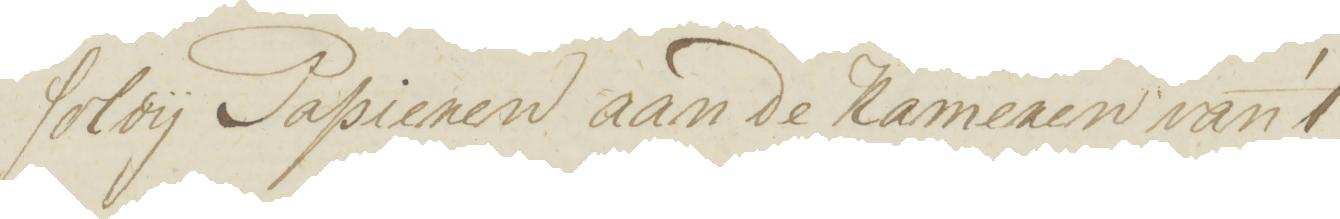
soldij Papieren aan de Kameren van ’t
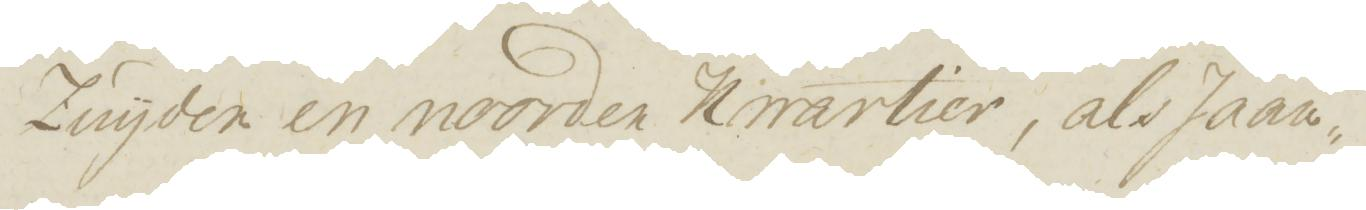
Zuijder en noorder Kwartier, als Jaar„
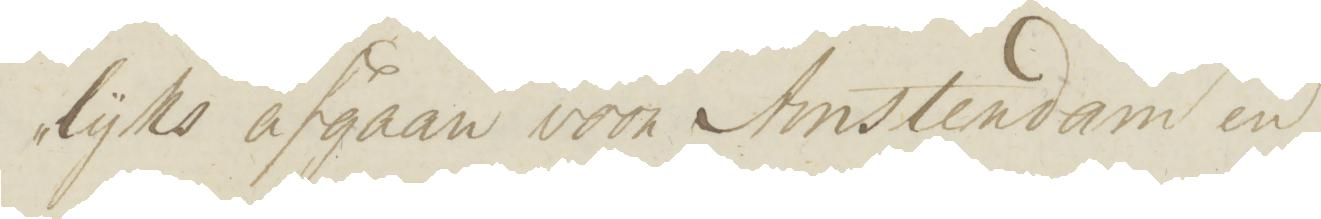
„lijks afgaan voor Amsterdam en
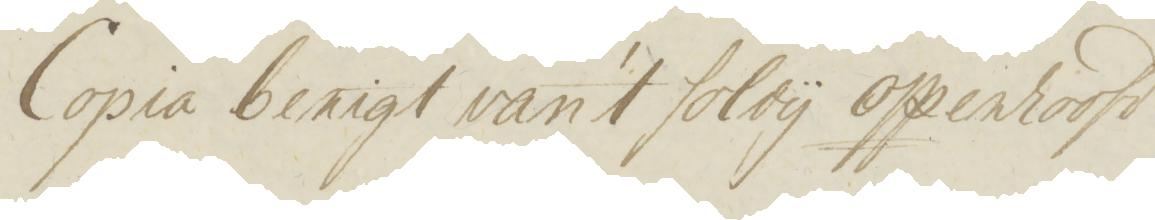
Copia berigt van ’t soldij opperhoofd
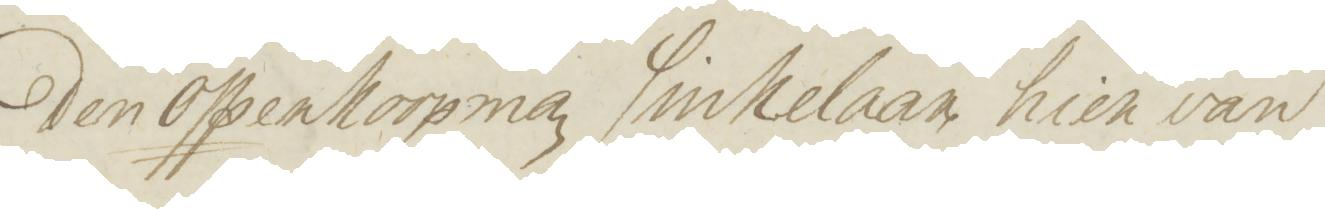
den opperkoopman sinkelaar hier van
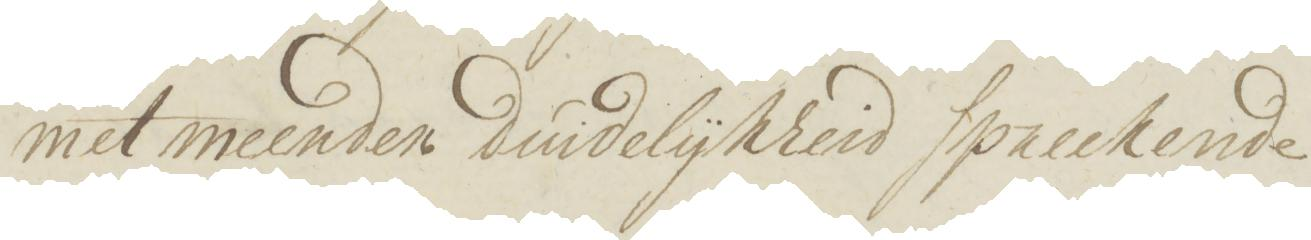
met meerder duidelijkheid spreekende
